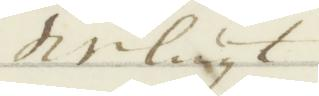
Nvlugt
